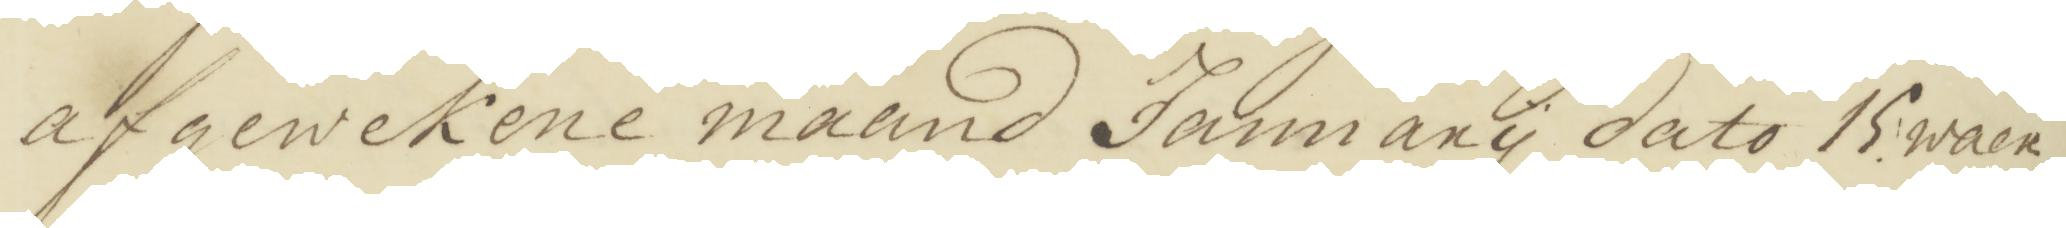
afgewekene maand Ianuarij dato 15: waer
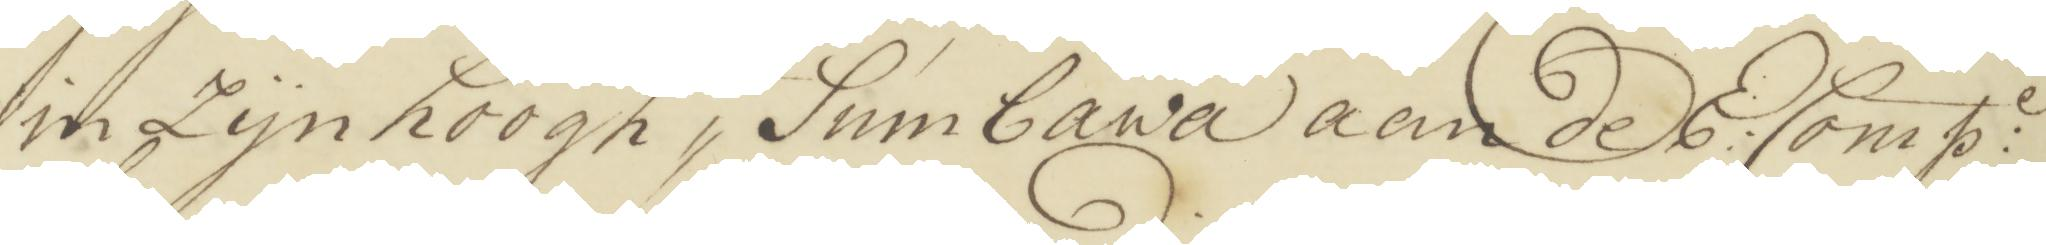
in zijn hoogh„t Sumbawa aan de E: Comp:e
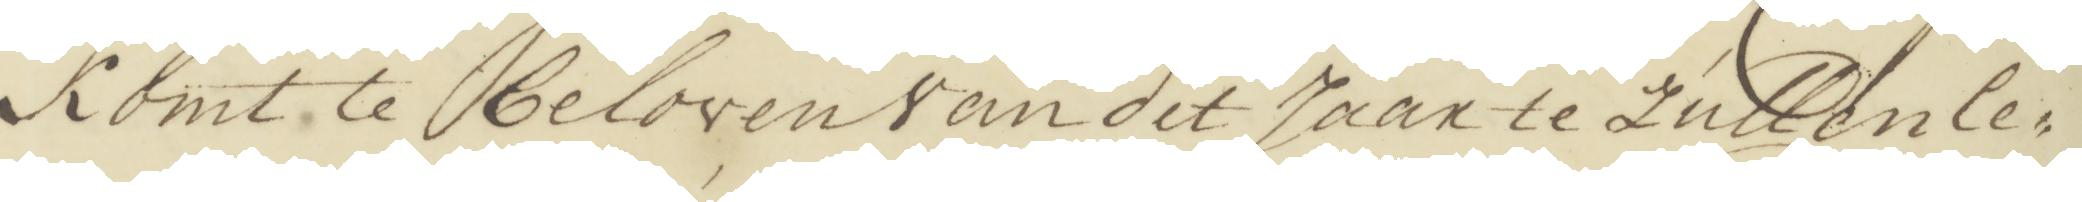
komt te beloven van dit Jaar te zullen le„
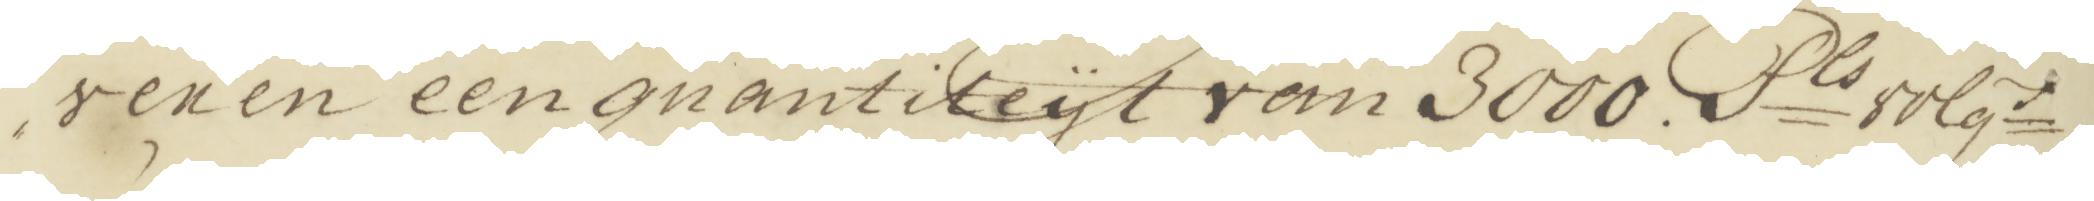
„veren een quantiteijt van 3000. P=ls volg=s
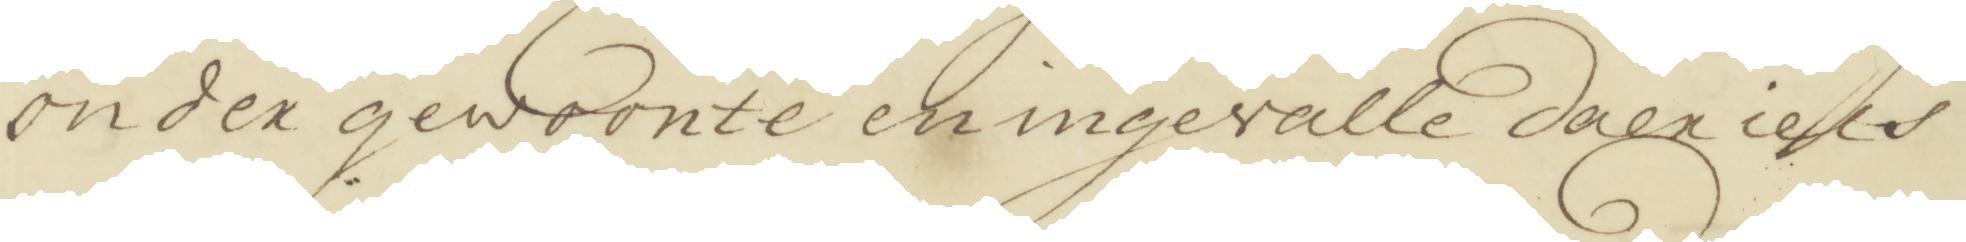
ouder gewoonte en ingevalle daer iets
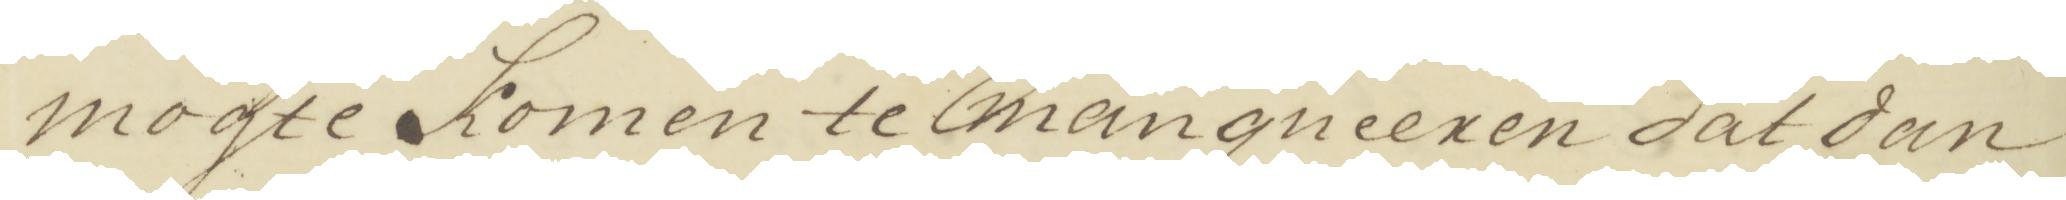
mogte komen te manqueeren dat dan
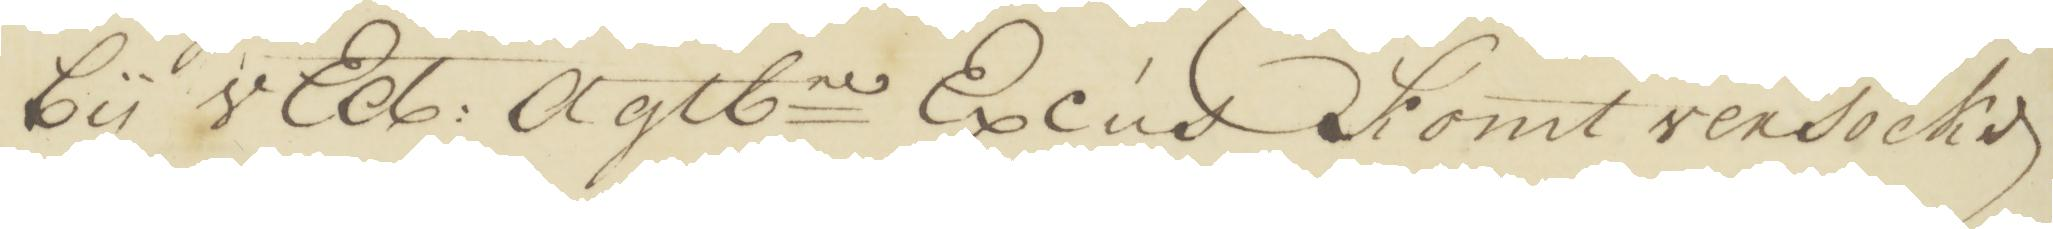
bij vEd: Agtb=re Excus komt versoeken
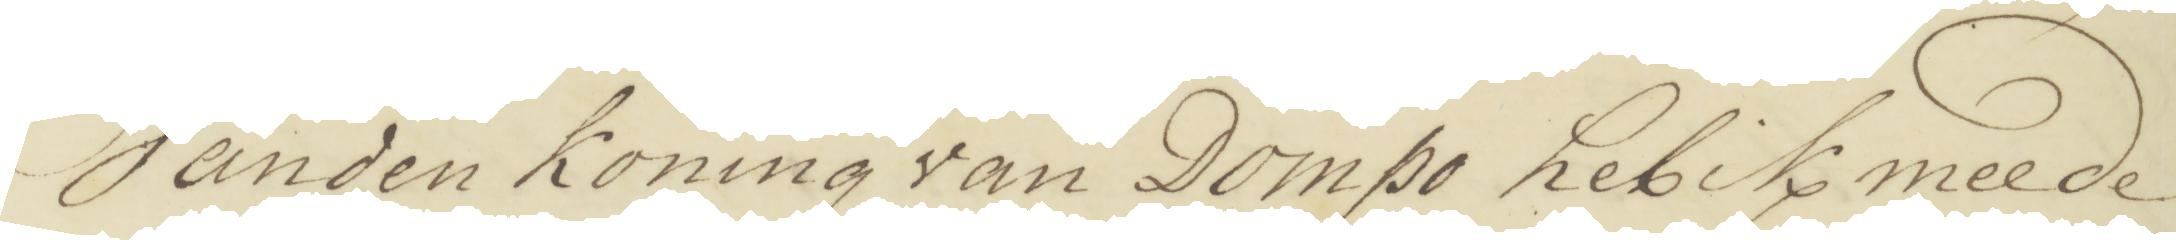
van den koning van Dompo heb ik meede
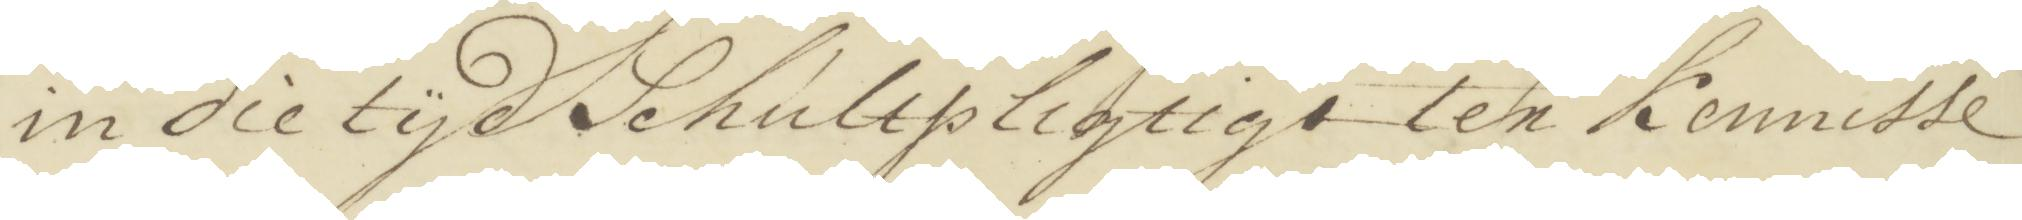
in die tijd schultpligtigt ter kennisse
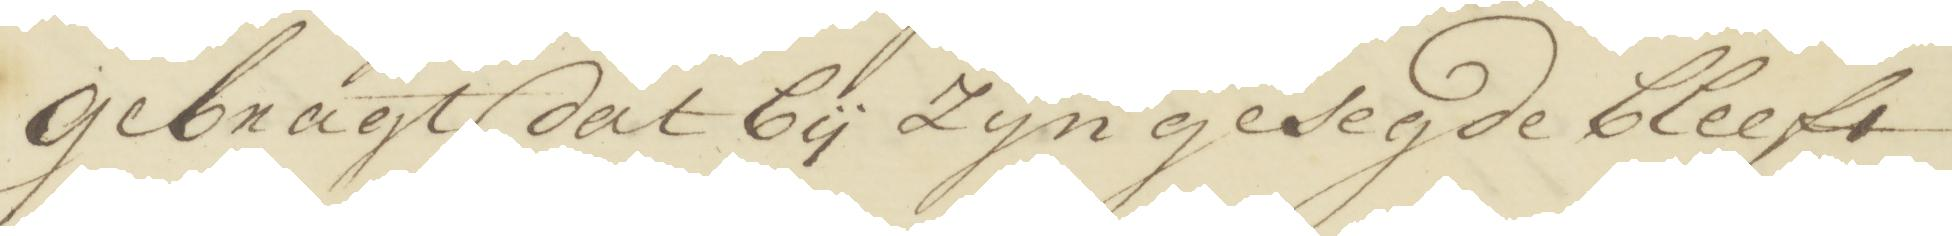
gebragt dat bij zijn gesegde bleeft
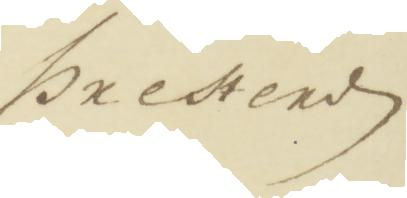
presteren
